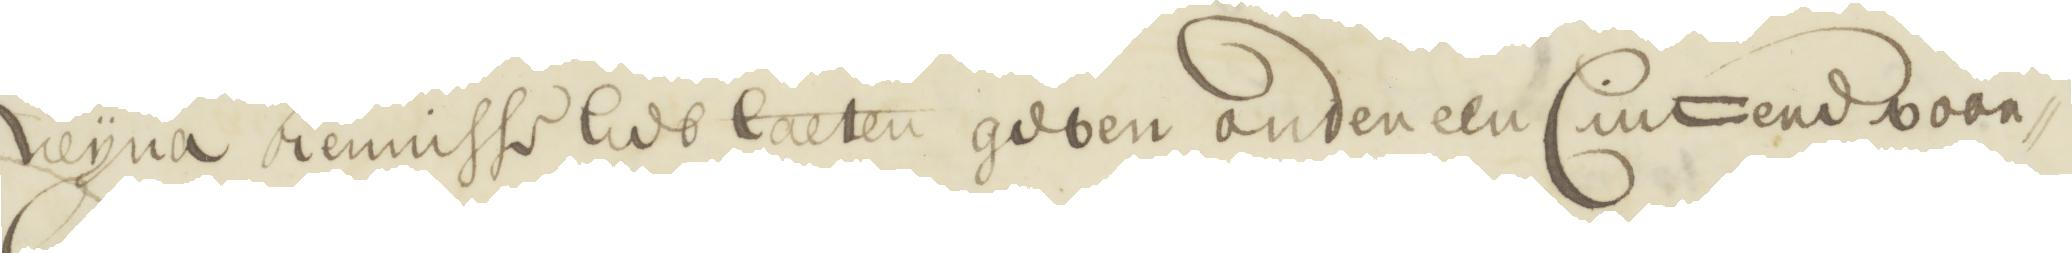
neijna kennisse heb laeten geven onder een Cincere voor„
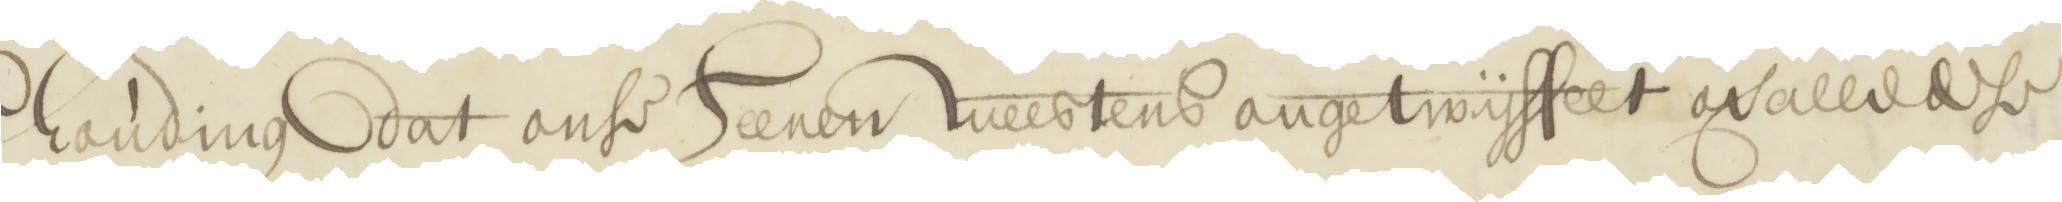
houding dat onse heeren meesters ongetwijffelt over alle dese
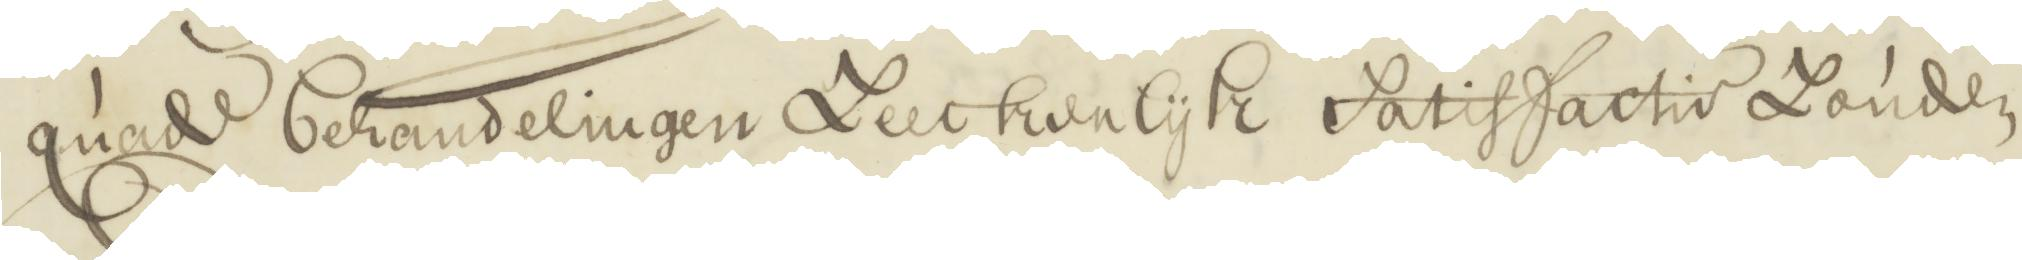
quade behandelingen Zeeckerlijk Satisfactie Zouden
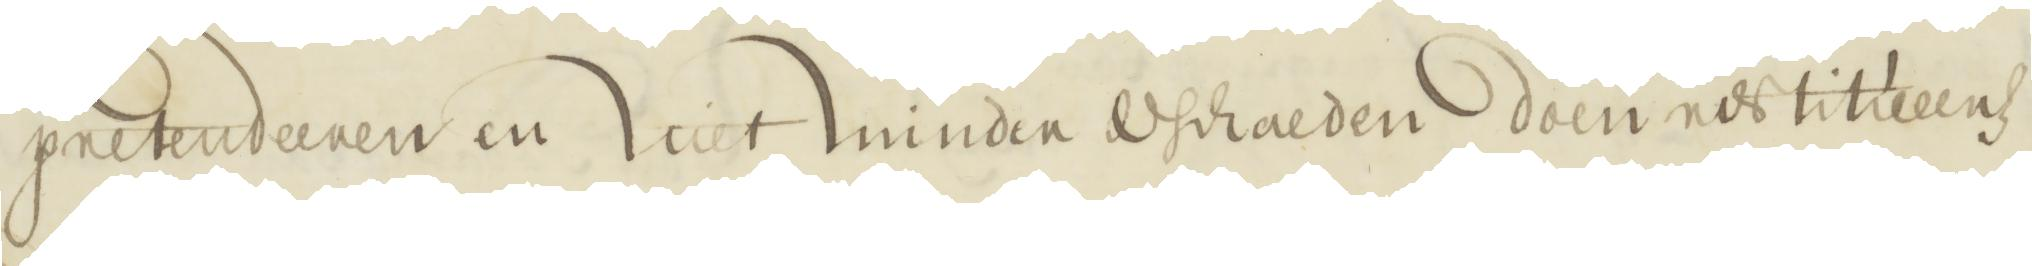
pretendeeren en niet minder de schaeden doen restitueeren
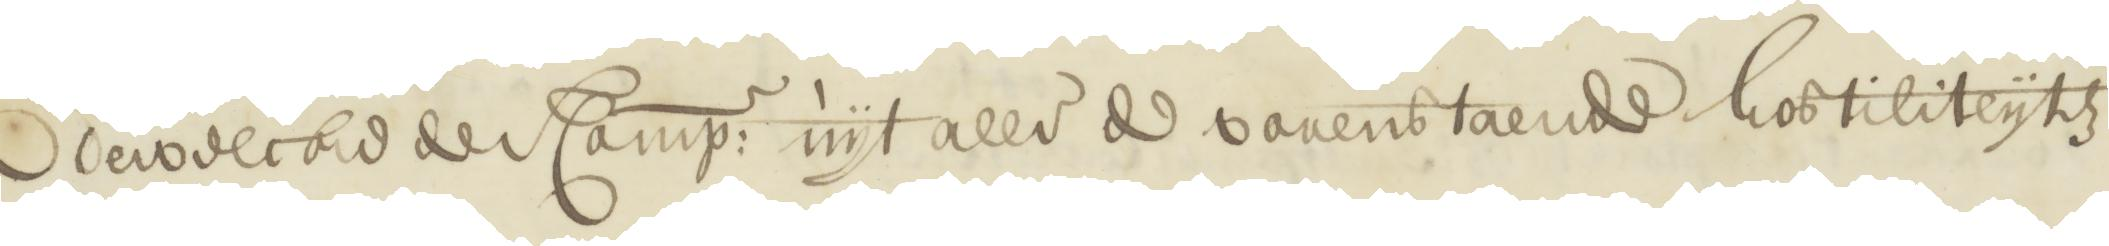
dewelcke de EComp:e uijt alle de vorenstaende hostiliteijten
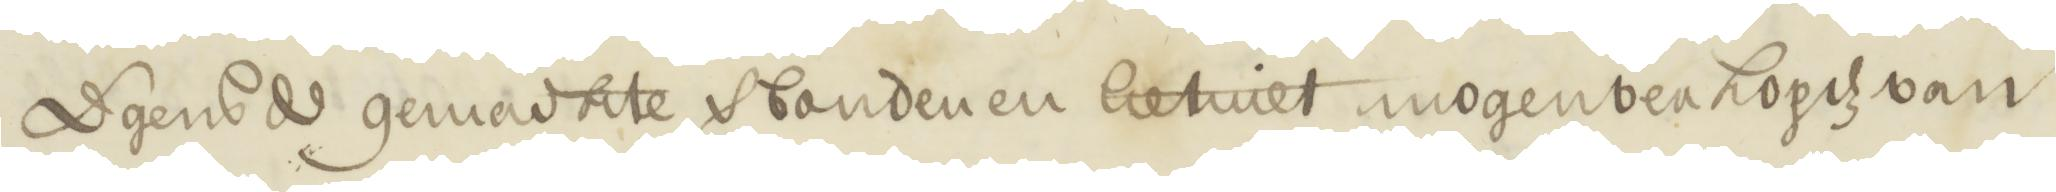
tegens de gemaekte verbonden en het niet mogen verkopen van
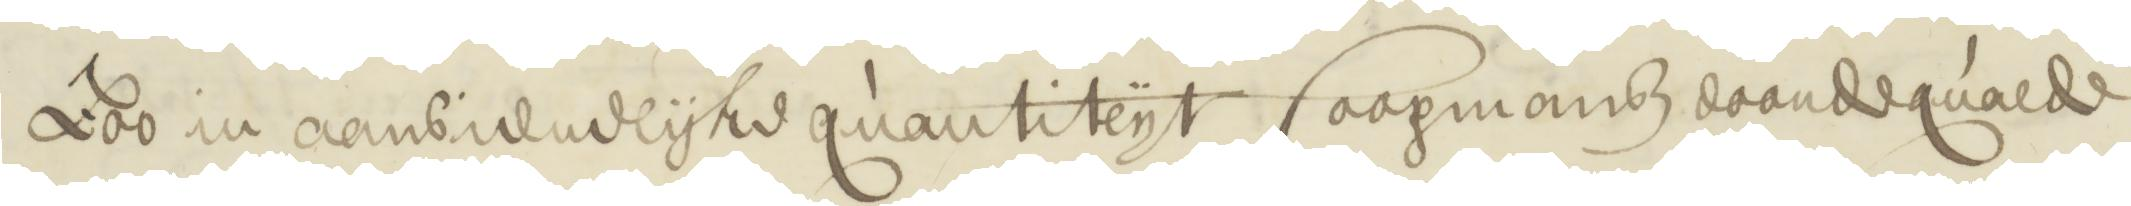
Zoo in aansienelijke quantiteijt Coopmans door de quaede
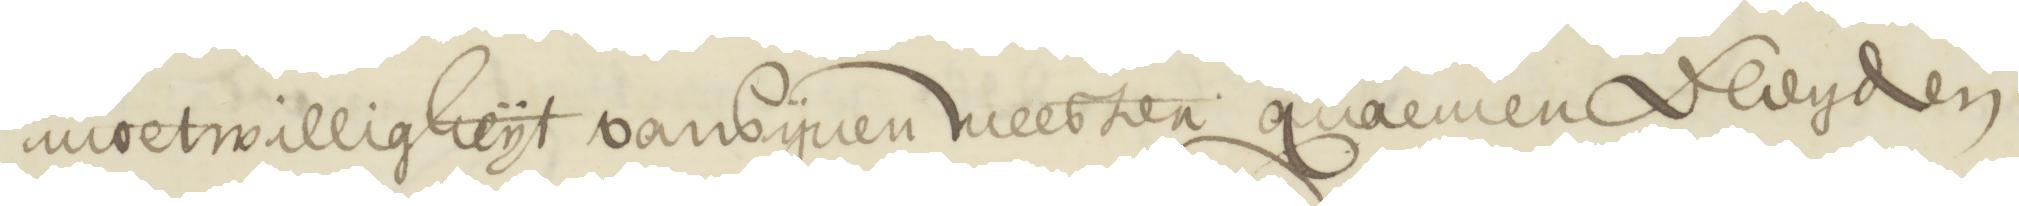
moetwilligheijt van sijnen meester quaemen te leyden
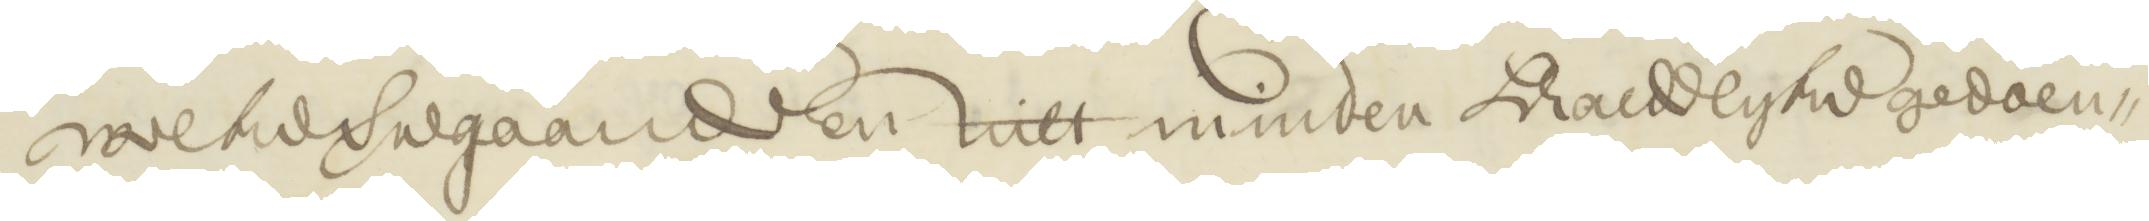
welke veregaande en niet minder schaedelyke gedoen„
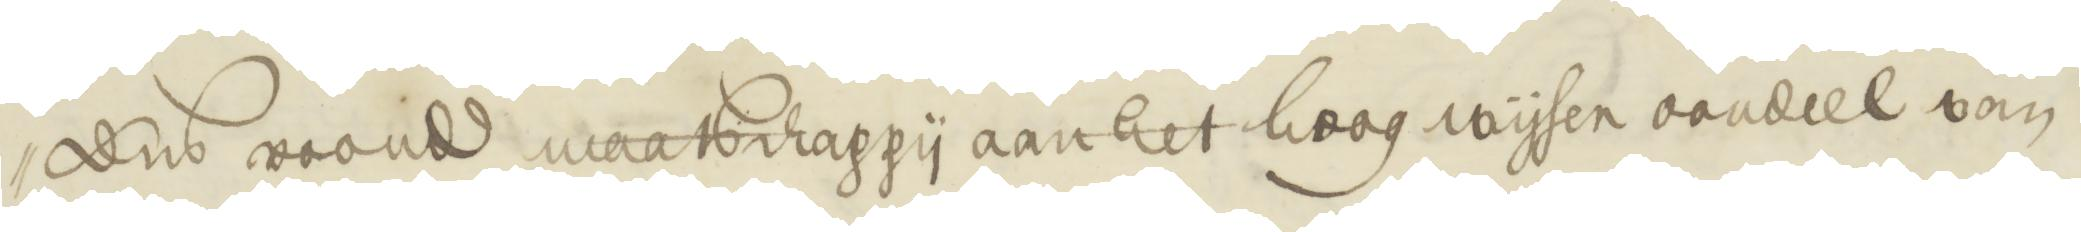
„tens voorde maatschappij aan het hoog wijser oordeel van
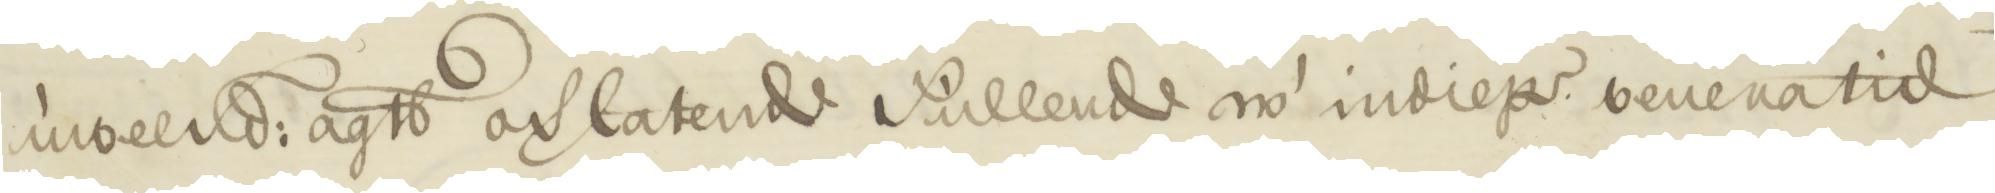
uwel Ed: agtb overlatende Sullende w' indiepe veneratie
